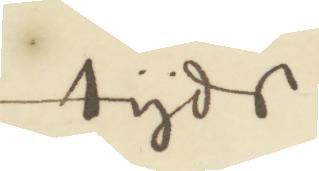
tijds
